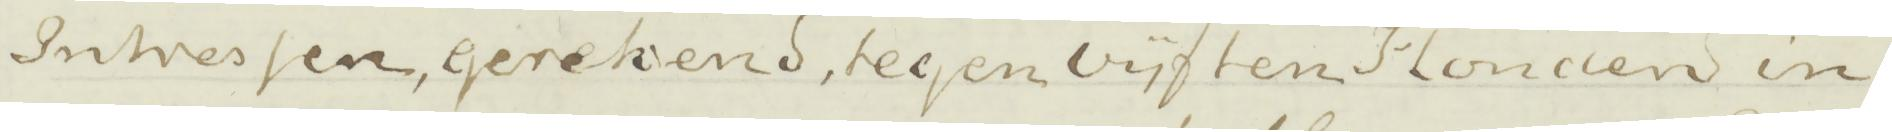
Intressen, Gerekend, tegen vijften Honderd in
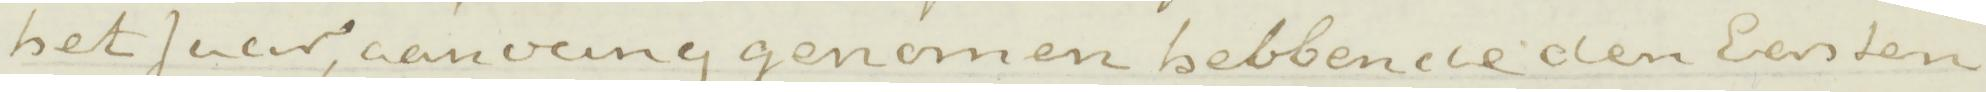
het jaar, aanvang genomen hebbende den Eersten
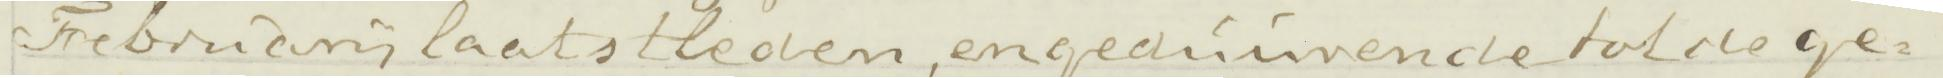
Februarij laatstleden, en geduurende tot de ge=
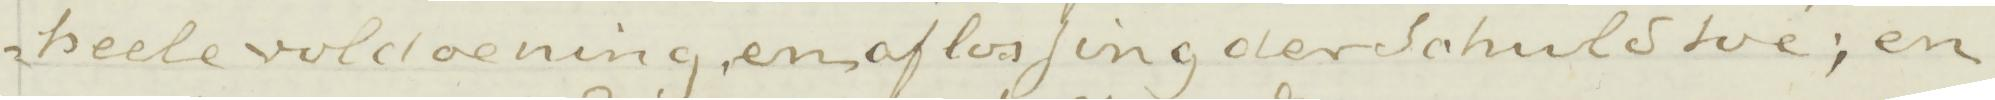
=heele voldoening, en aflossing der schuld toe; en
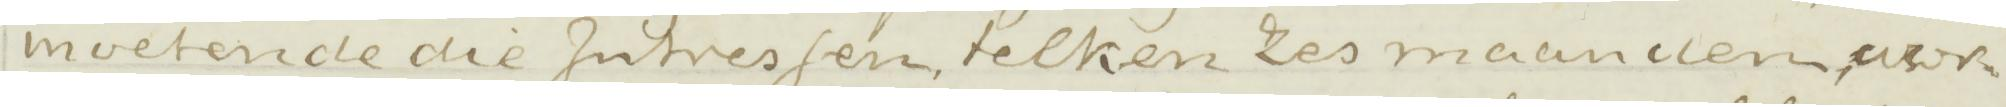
moetende die Jntressen, telken zes maanden, wor„
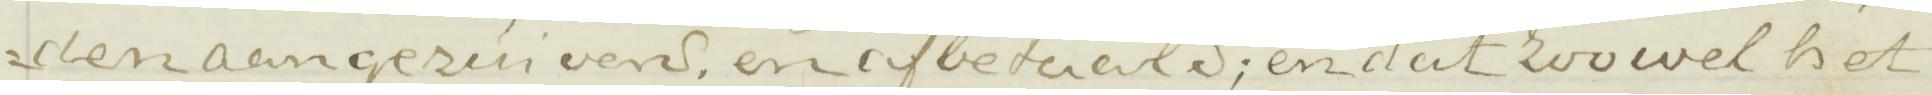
=den aangezuiverd, en afbetaald; en dat zoo wel het
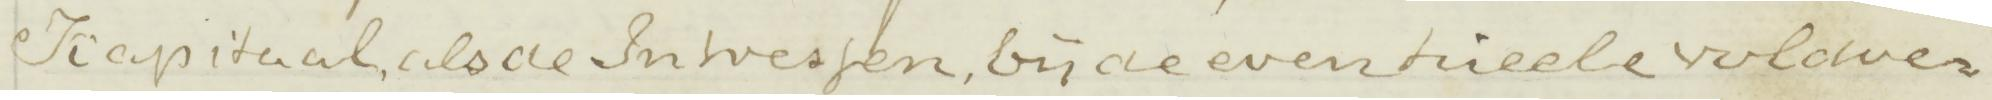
Kapitaal, als de Intressen, bij de eventueele voldoe=
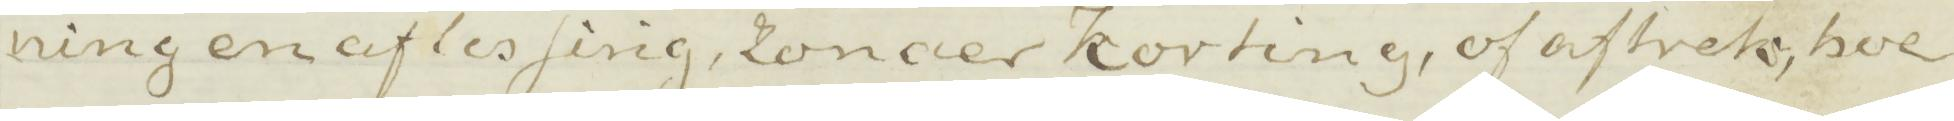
ning en aflossing, zonder korting, of aftrek, hoe
